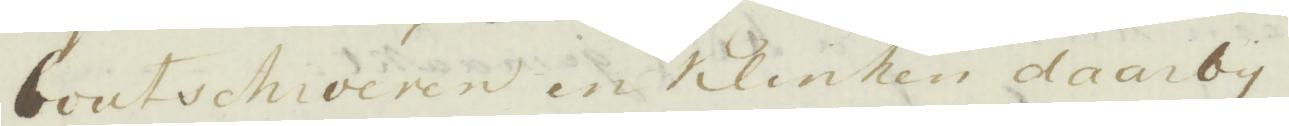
boutschroeven en Klinken daarbij
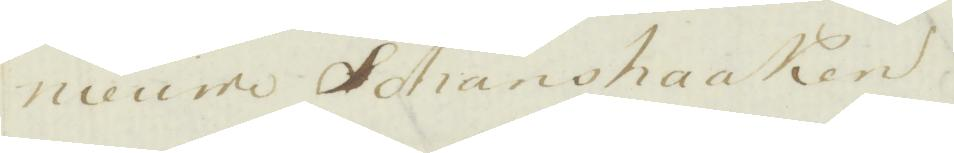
nieuwe Schanshaaken.
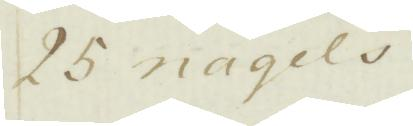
25 nagels
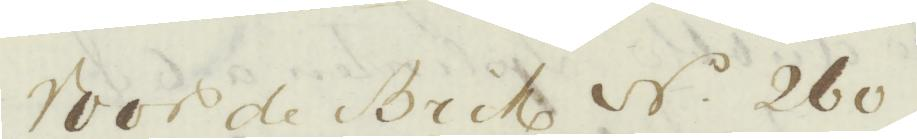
Voor de Brik N. 260
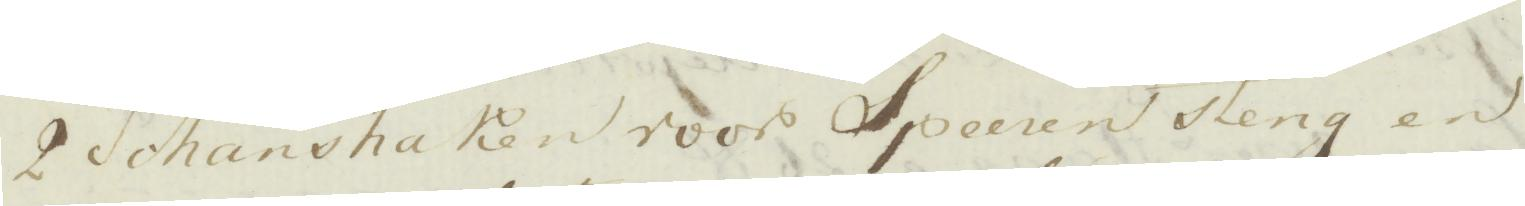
2 Schanshaken voor Speeren steng en
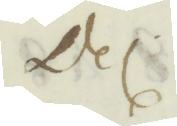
Dec
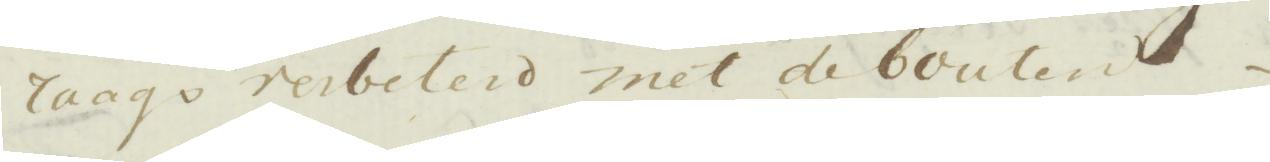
raags verbeterd met de bouten
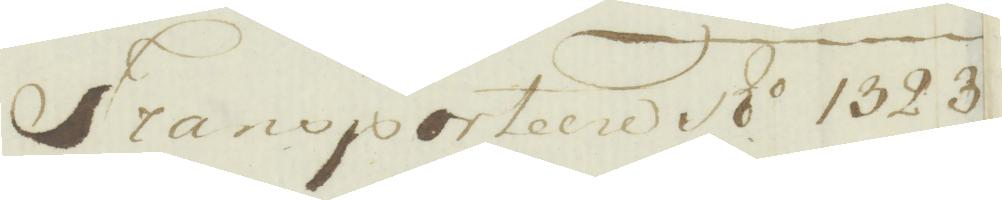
Transporteere Rd 1323.
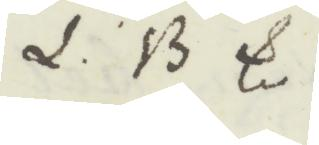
L. 13 ver
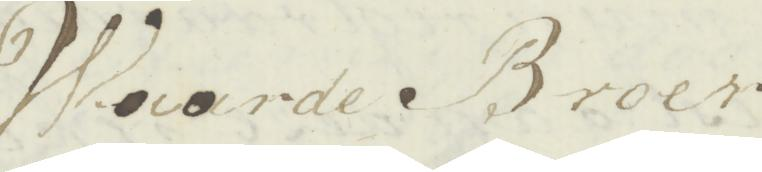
Waarde Broer
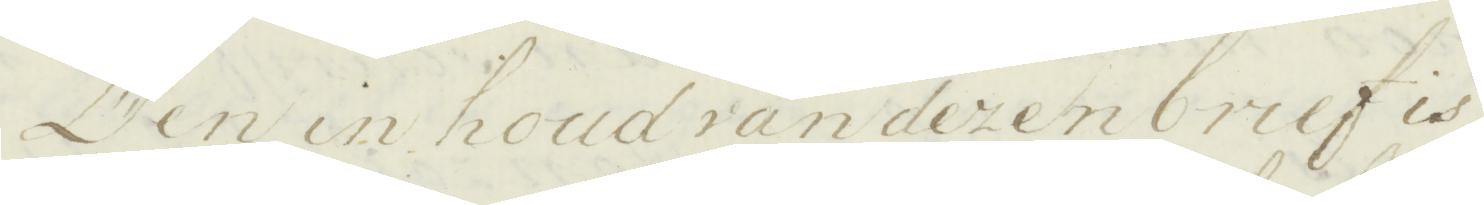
Den inhoud van dezen brief is
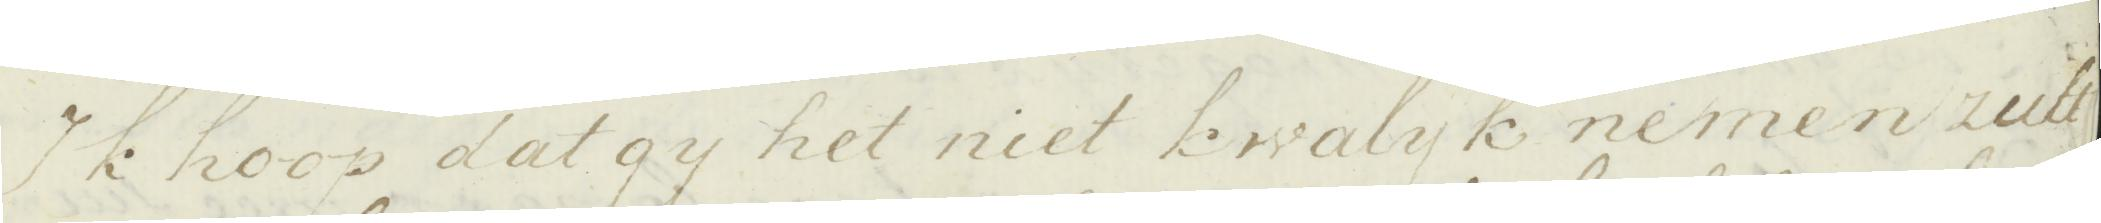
Ik hoop dat gy het niet kwalyk nemen zult
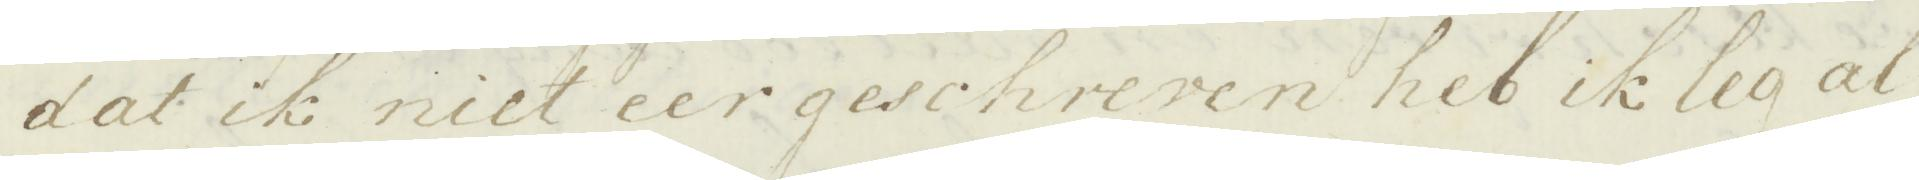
dat ik niet eer geschreven heb ik leg al
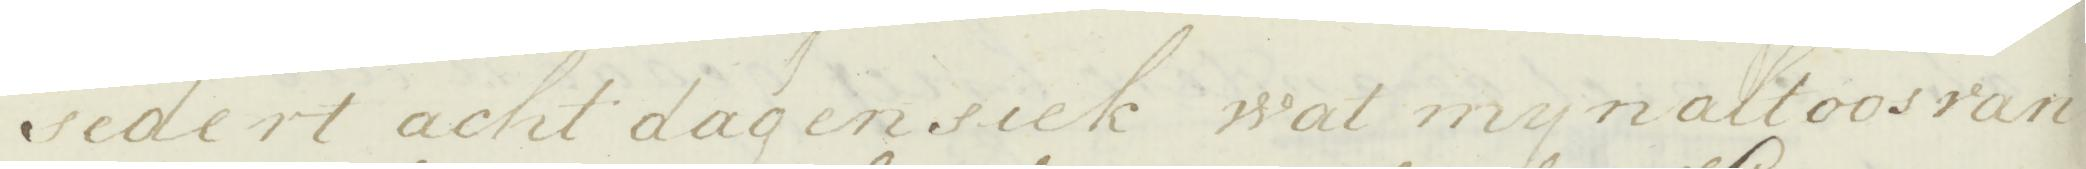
sedert acht dagen siek wat mjn altoos van
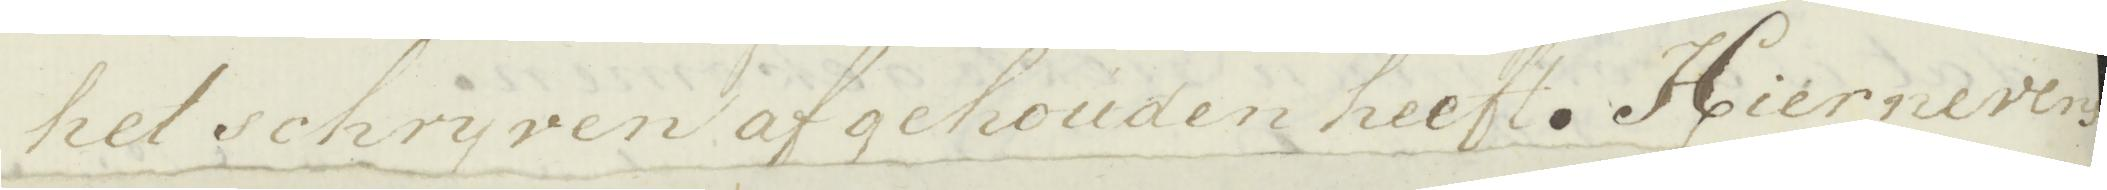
het schrijven afgehouden heeft Hiernevens
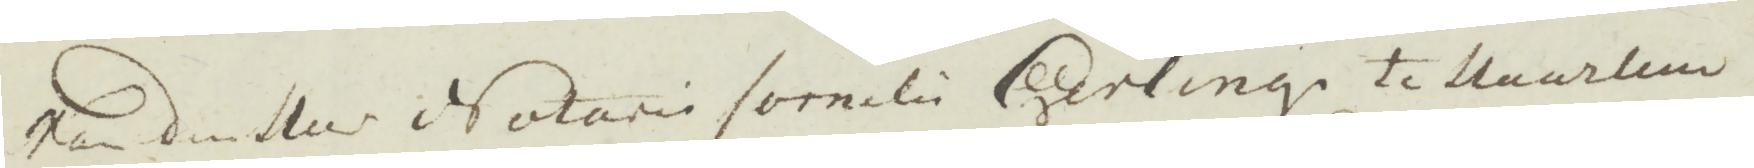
Van der Heer Notaris Cornelis Geerlings te Haarlem
